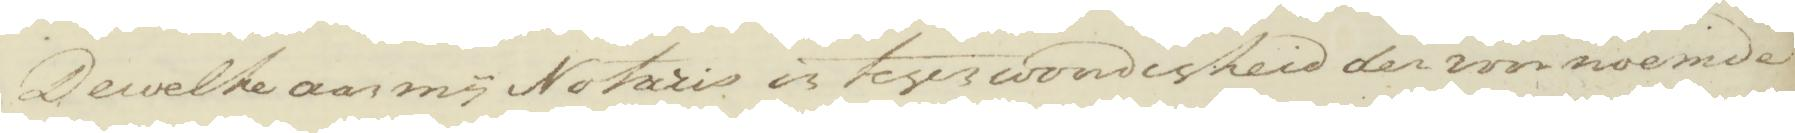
Dewelke aan mij Notaris in tegenwoordigheid der voornoemde
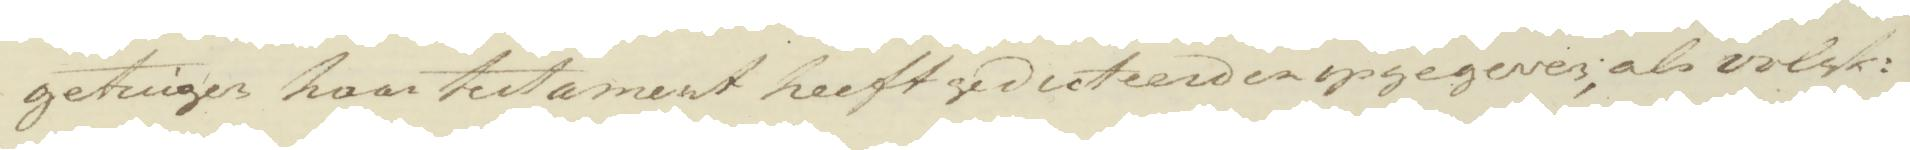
getuigen haar testament heeft gedicteerd en opgegeven, als volgt:
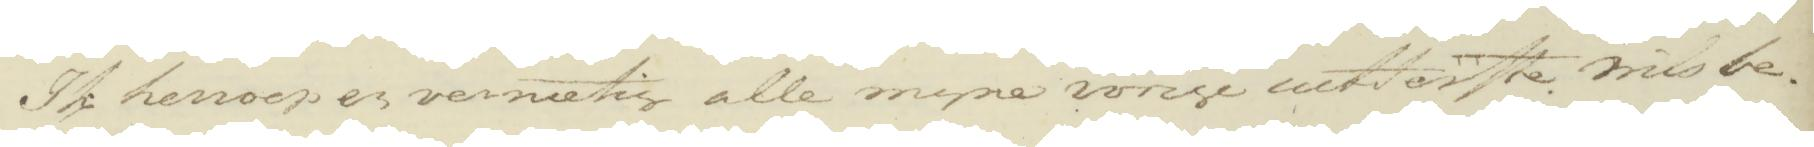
Ik herroep en vernietig alle myne vorige uitterste wils be„
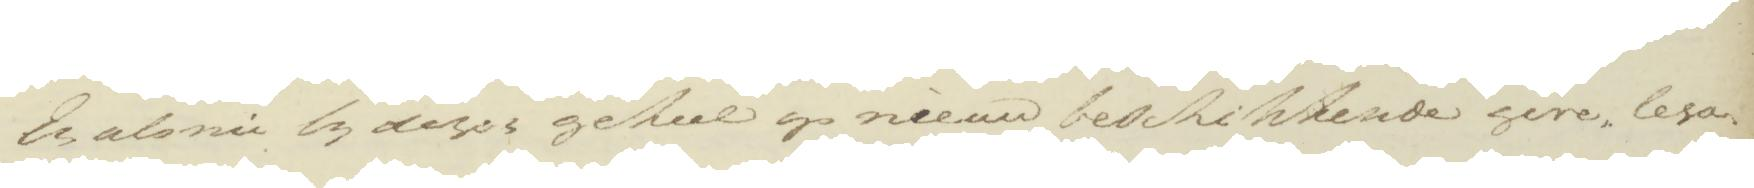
En als nu by dezen geheel op nieuw beschikkende geve, lega
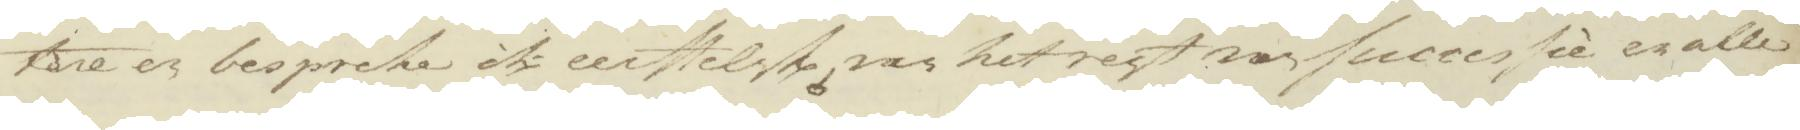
tere en bespreke ik eerstelyk, ¶ van het regt van successie en alle
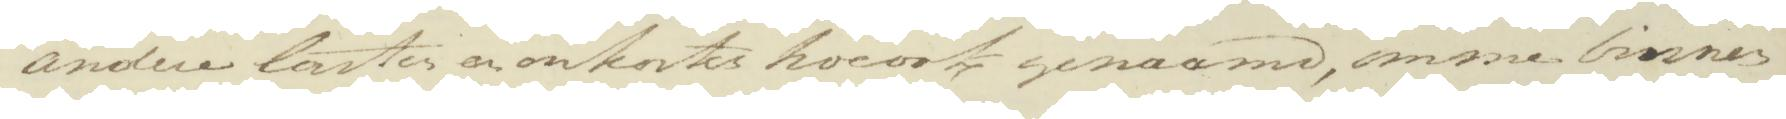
andere lasten en onkosten hoe ook genaamd, omme binnen
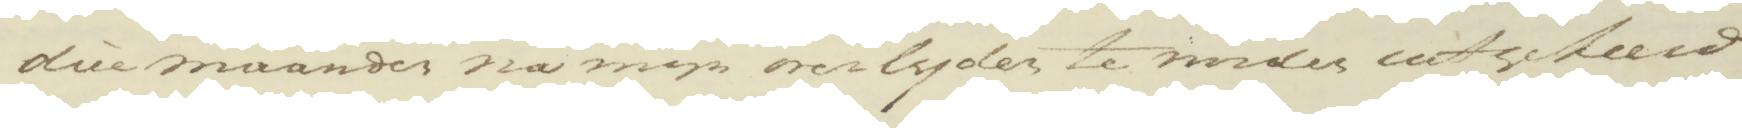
drie maanden na myn overlyden te worden uitgekeerd
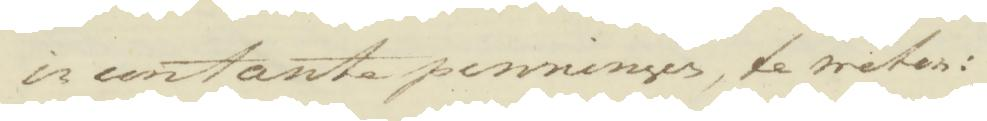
in contante penningen, te weten:
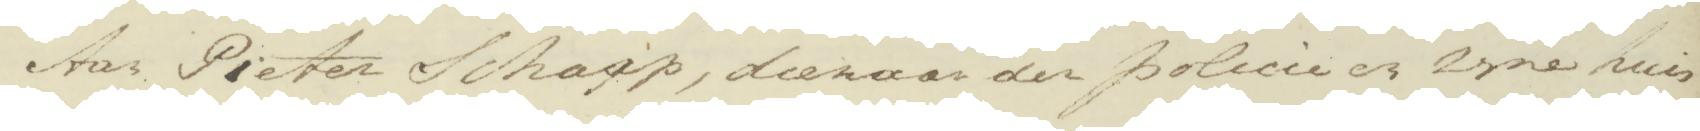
Aan Pieter Schapp, dienaar der policie en zyne huis
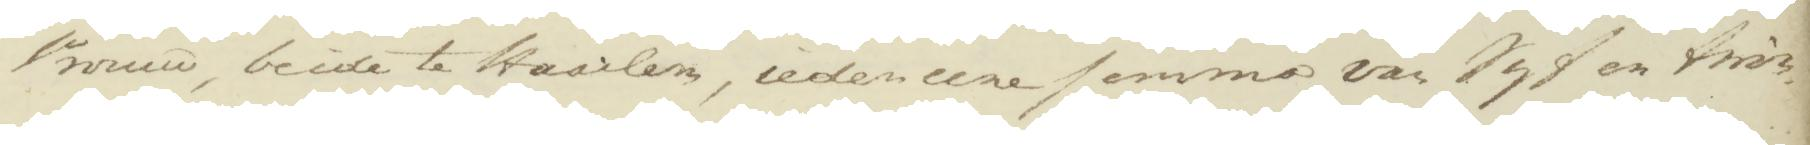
Vrouw, beide te Haarlem, ieder eene somma van Vyf en twin
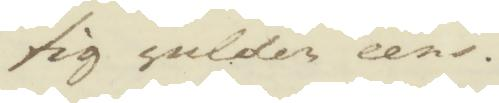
tig gulden eens.
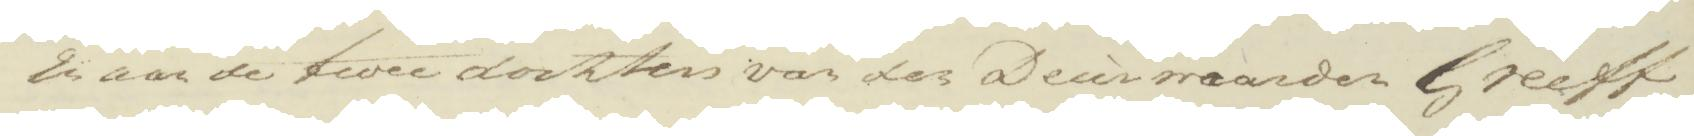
En aan de twee dochters van den Deurwaarder Greeff
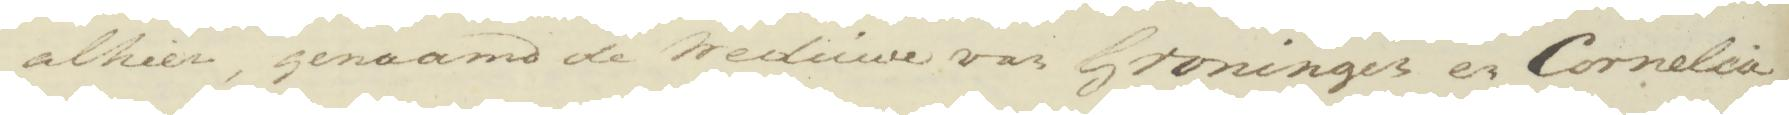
alhier, genaamd de Weduwe van Groningen en Cornelia
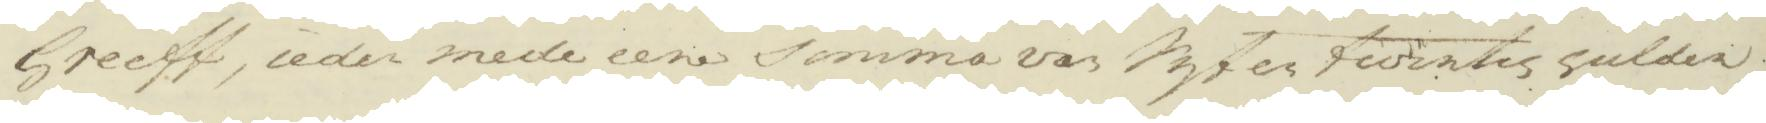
Greeff, ieder mede eene somma van Vyf en twintig gulden
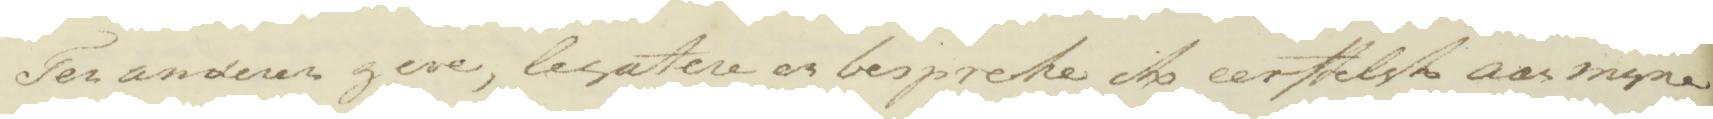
Ter anderen geve, legatere en bespreke ik eerstelyk aan myne
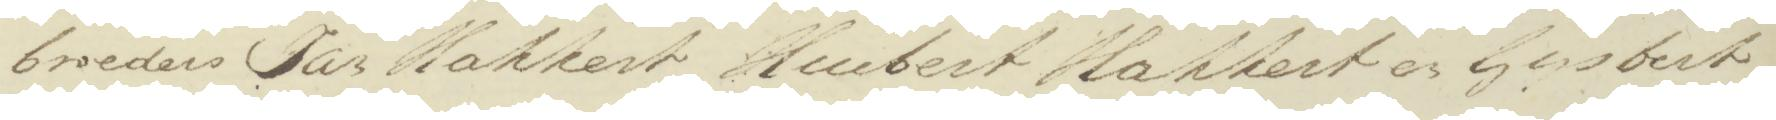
broeders Jan Hakkert, Huibert Hakkert en Gysbert
